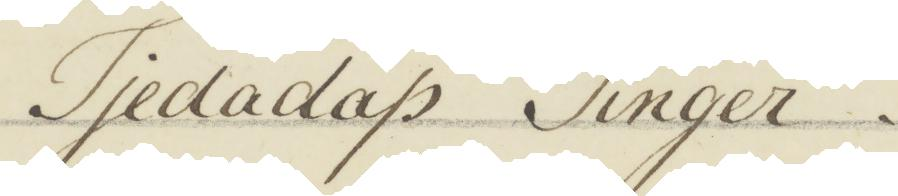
Tjedadap Tinger
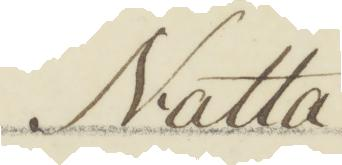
Natta
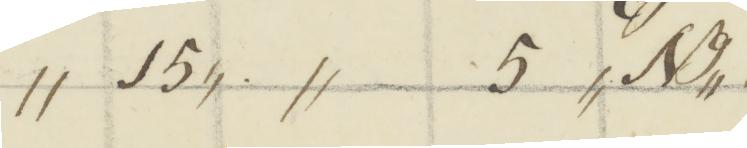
„ 15 „ „ 5 „ Ng„
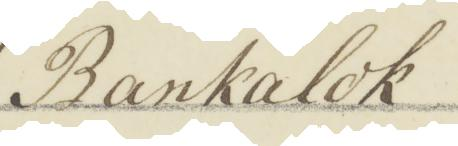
Bankalok
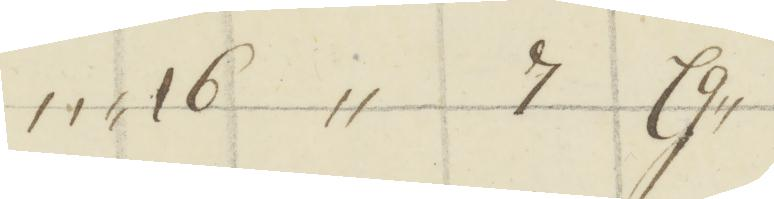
„ „ 16 „ 7 Cg„
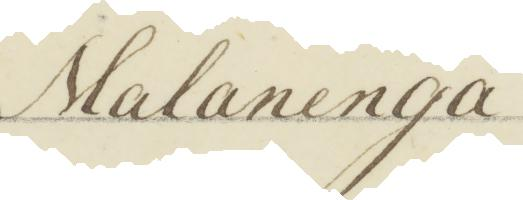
Malanenga
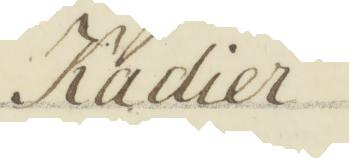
Kadier
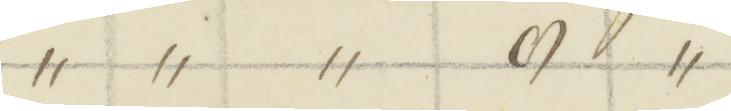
„ „ „ 8 „
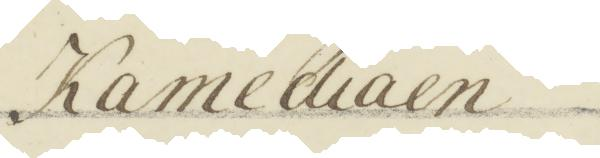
Kamediaen
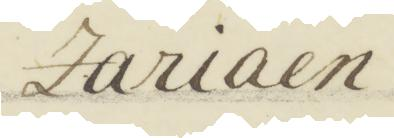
Zariaen
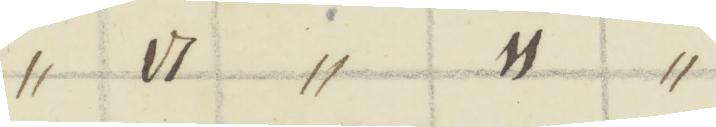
„ 17 „ 11 „
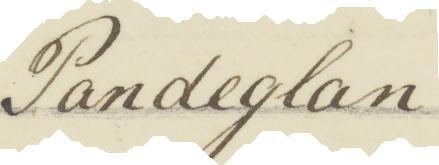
Pandeglan
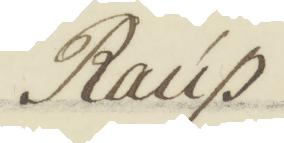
Raup
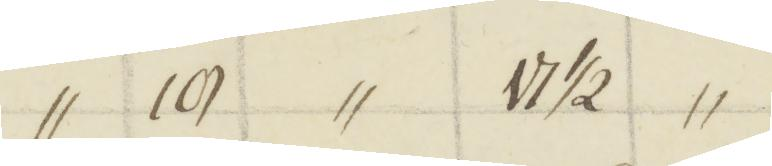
„ 18 „ 17½ „
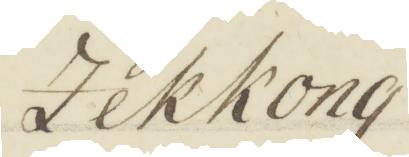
Zekkong
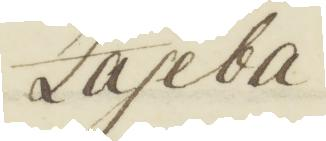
Zajeba
